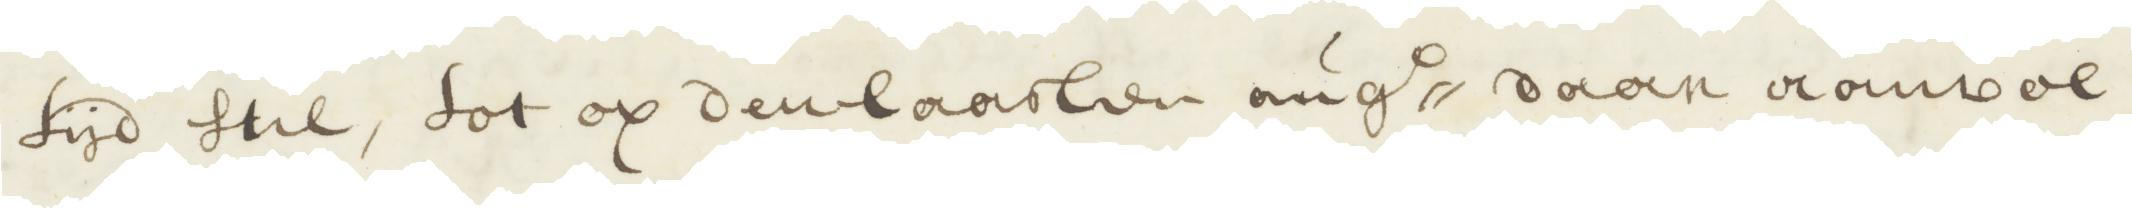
tijd stil, tot op den laasten aug„o daar aanvol
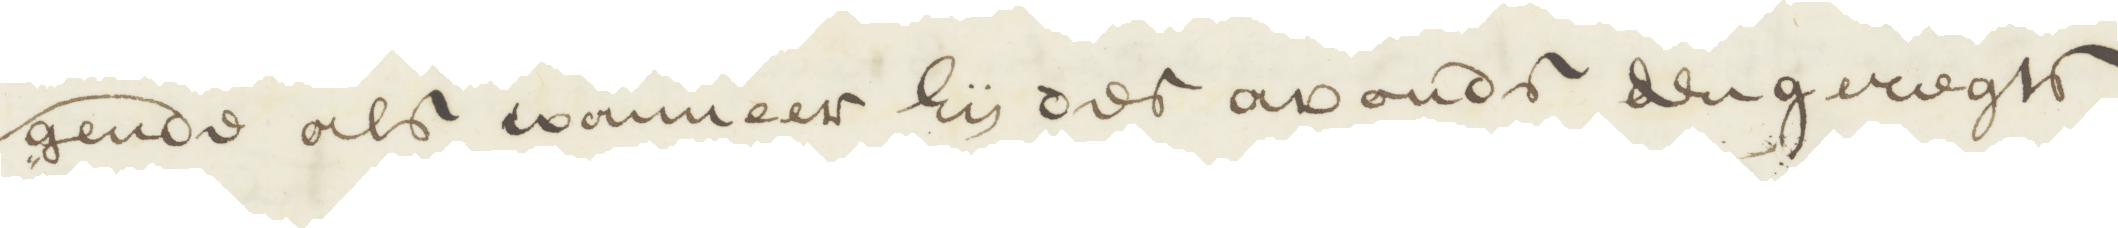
„gende als wanneer hij des avonds den geregts
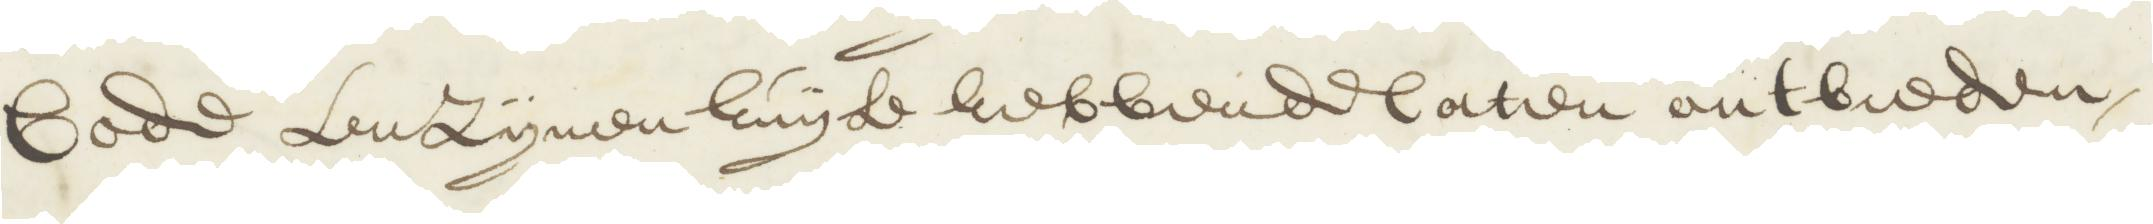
bode ten zijnen huijse hebbende laten ontbieden,
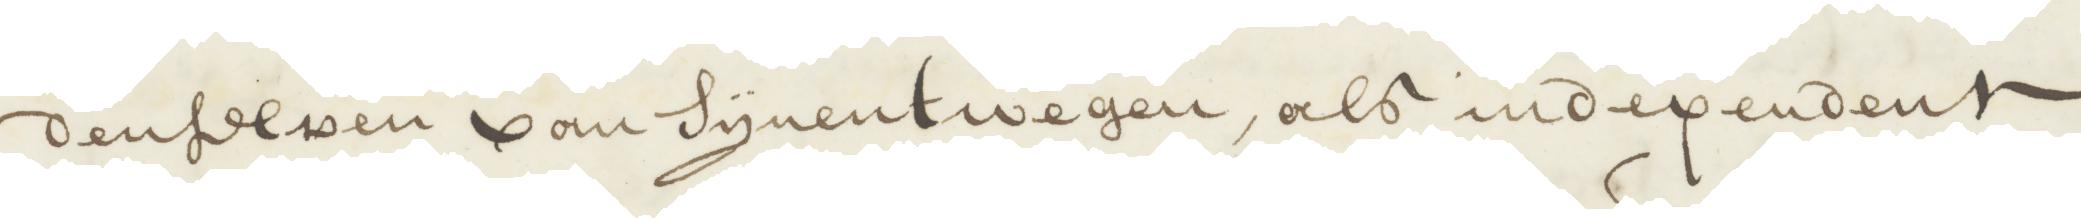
denselven van sijnentwegen, als independent
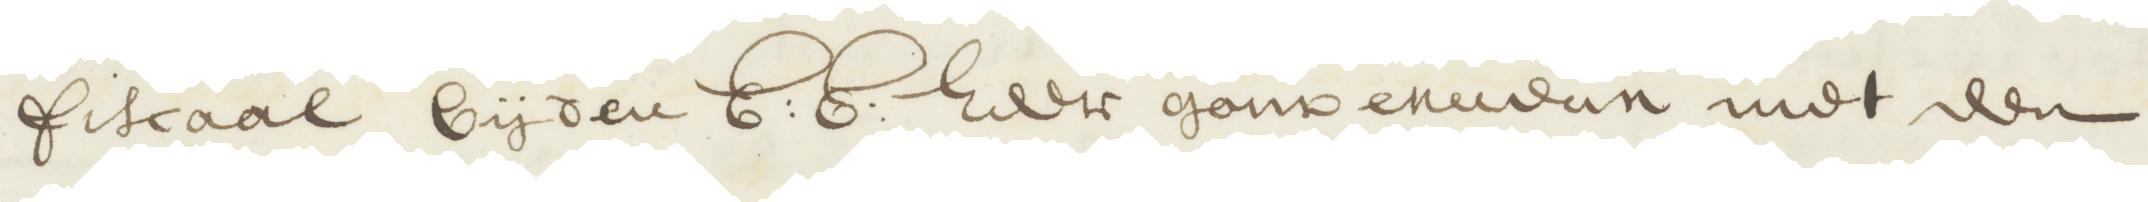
fiscaal bij den E: E: heer gouverneur met een
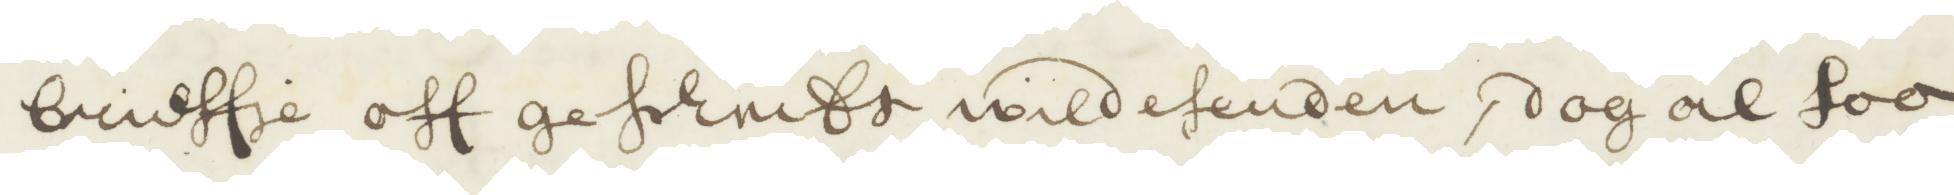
brieffje off geschrift wilde senden, dog al soo
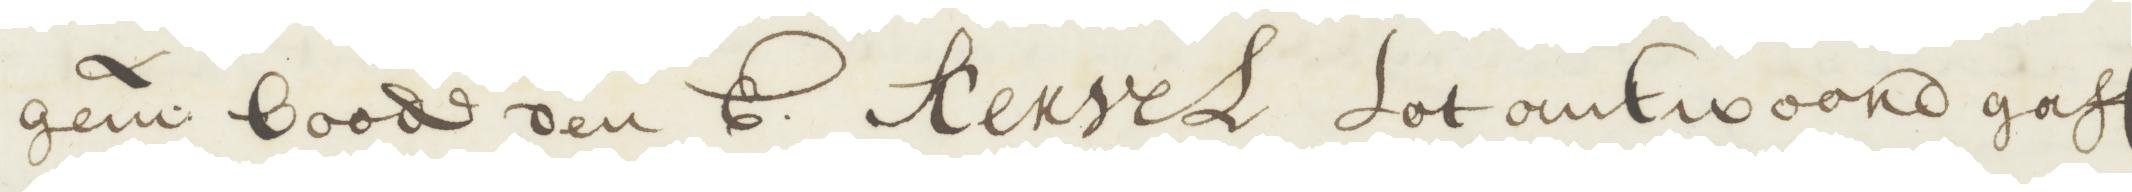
gem: boode den E: Kervel tot antwoord gaff,
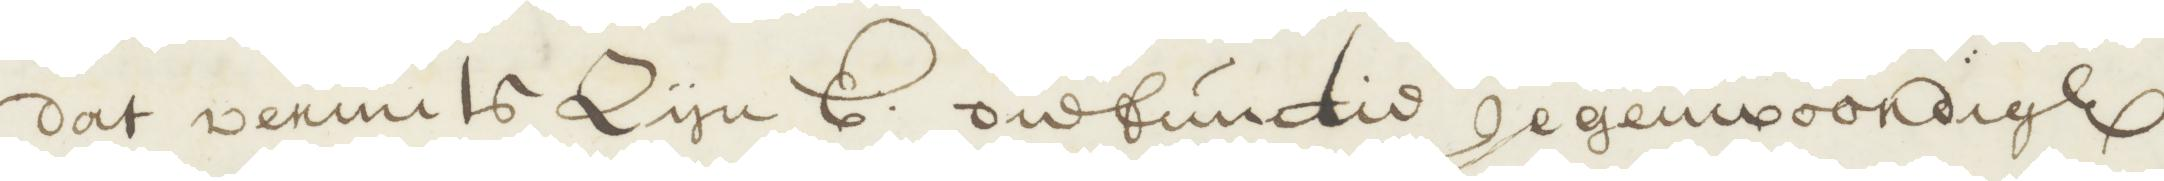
dat vermits zijn E: die functie Jegenwoordigh
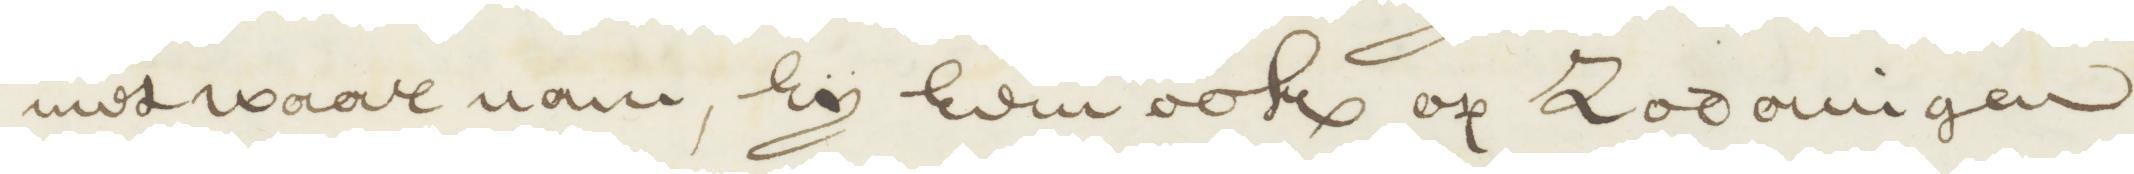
niet waar nam, hij hem ook op zodanigen
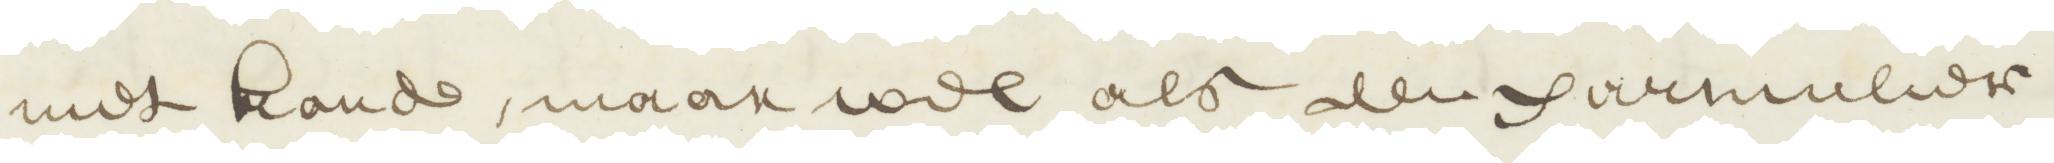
niet konde, maar wel als een particulier
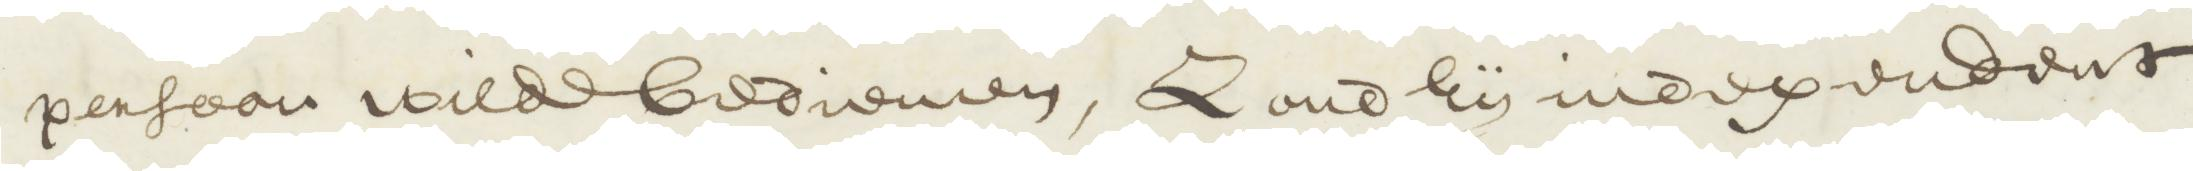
persoon wilde bedienen, zoud hij independent
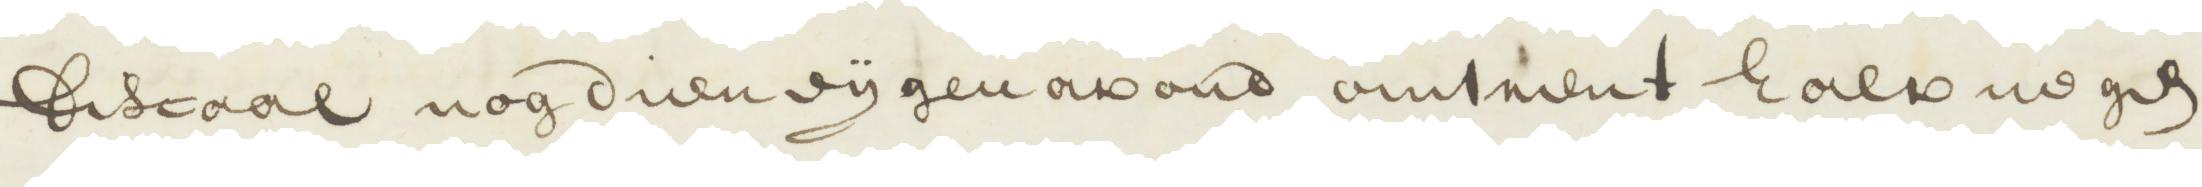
fiscaal nog dien eijgen avond omtrent halv negen
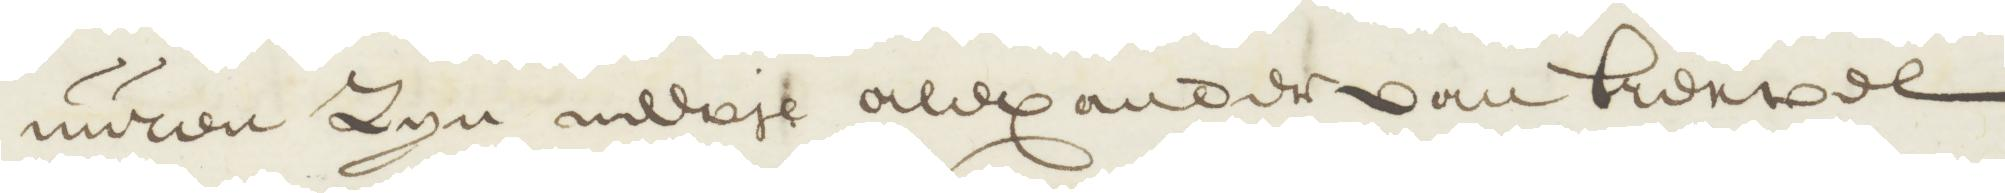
uuren zyn neevje alexander van kervel
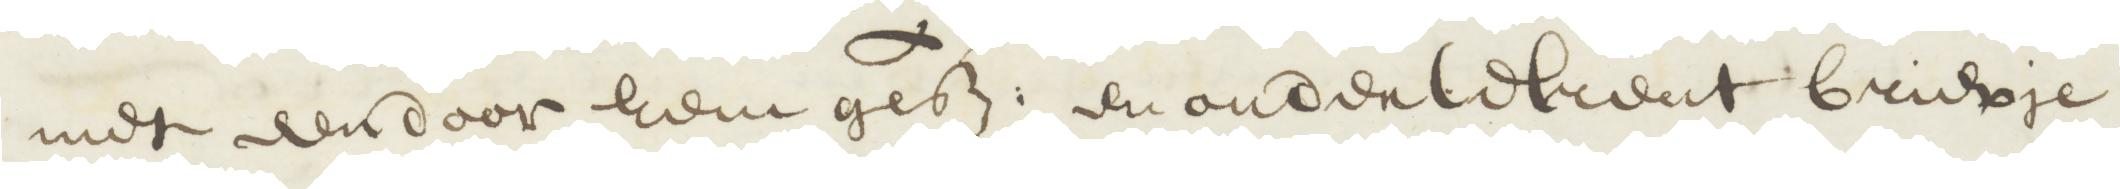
met een door hem gesz: en ondertekent brievje
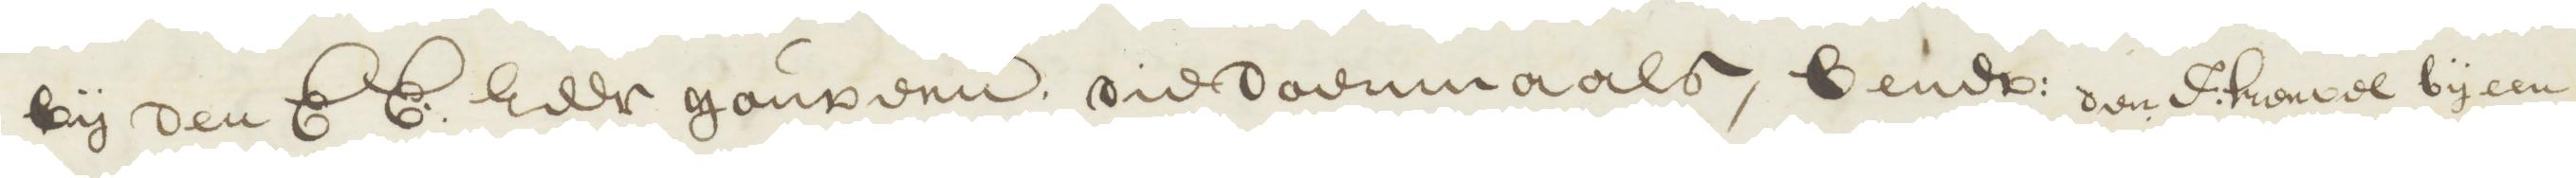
bij den E E. heer gouvern: die doenmaals, benev:s den E: kervel bij een
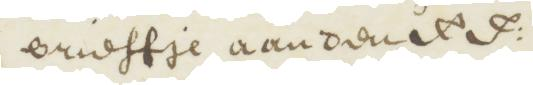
brieffje aan den E E:
